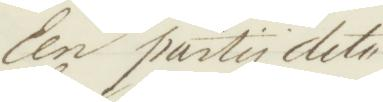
Een partij dito
